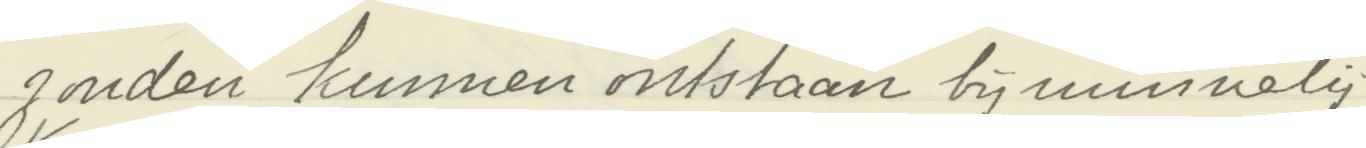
zouden kunnen ontstaan bij minnelij
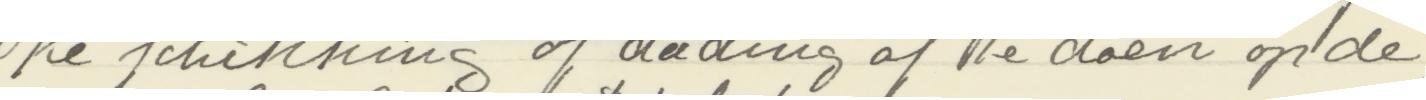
ke schikking of dading of te doen op de
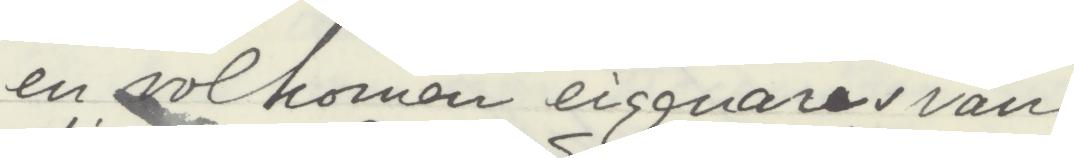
en volkomen eigenares van
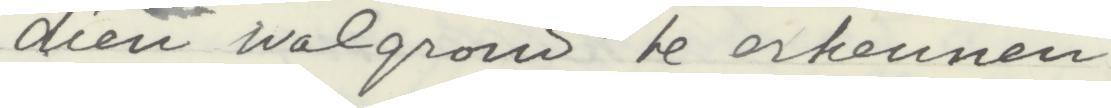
dien walgrond te erkennen
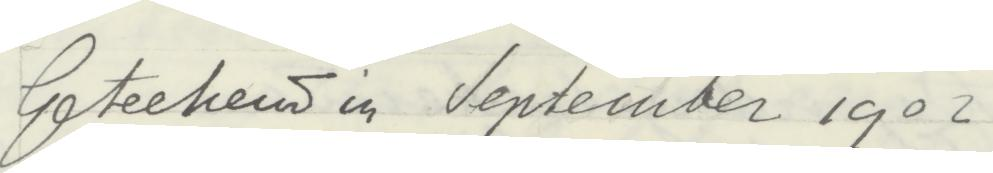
Geteekend in September 1902
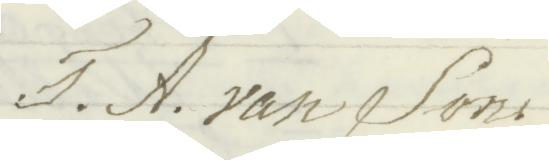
T. A. van Son.
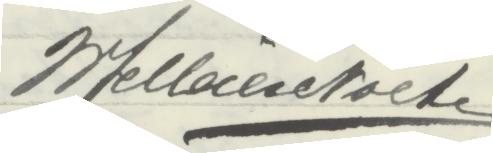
WFMeierNolk
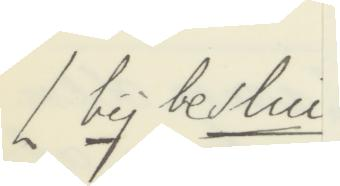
¶ bij beslui
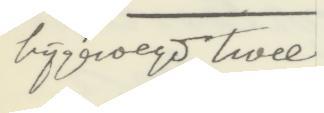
bijgevoegd twee
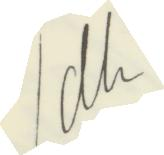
Tdk
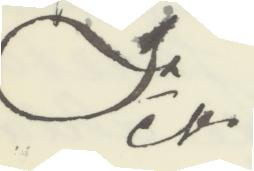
J=s N
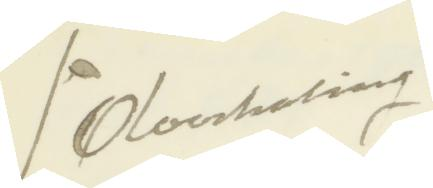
¶ doorhaling
